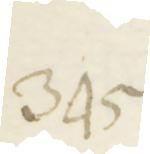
345
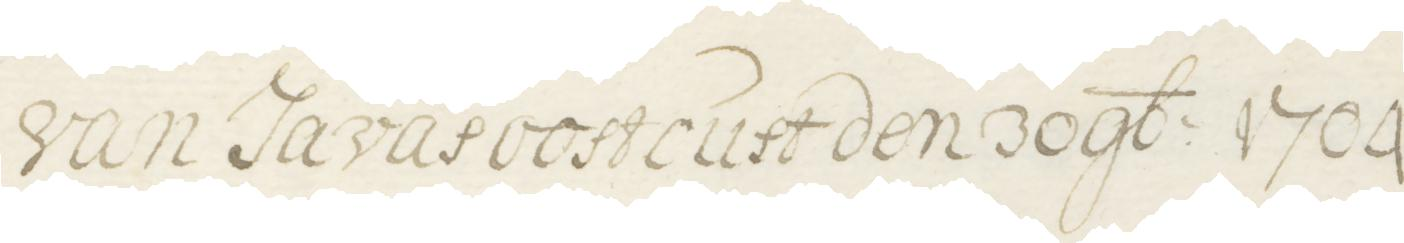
van Iavas oostcust den 30 9b: 1704
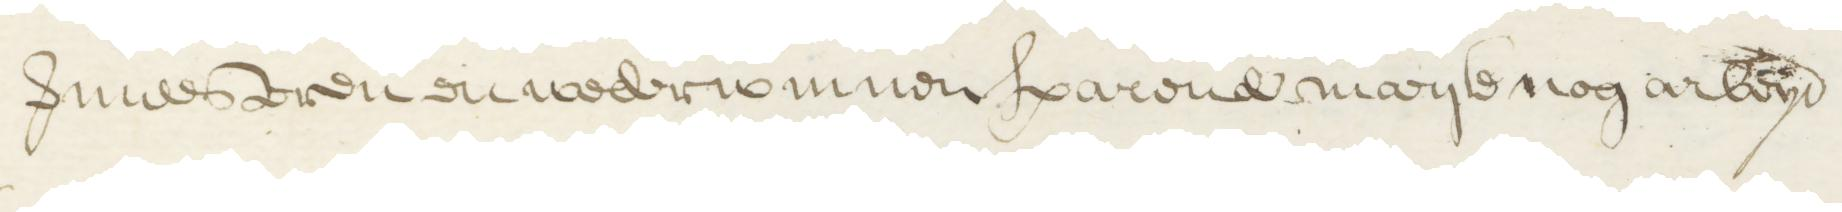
vermeestren en wederwinnen sparende moeyte nog arbeijd
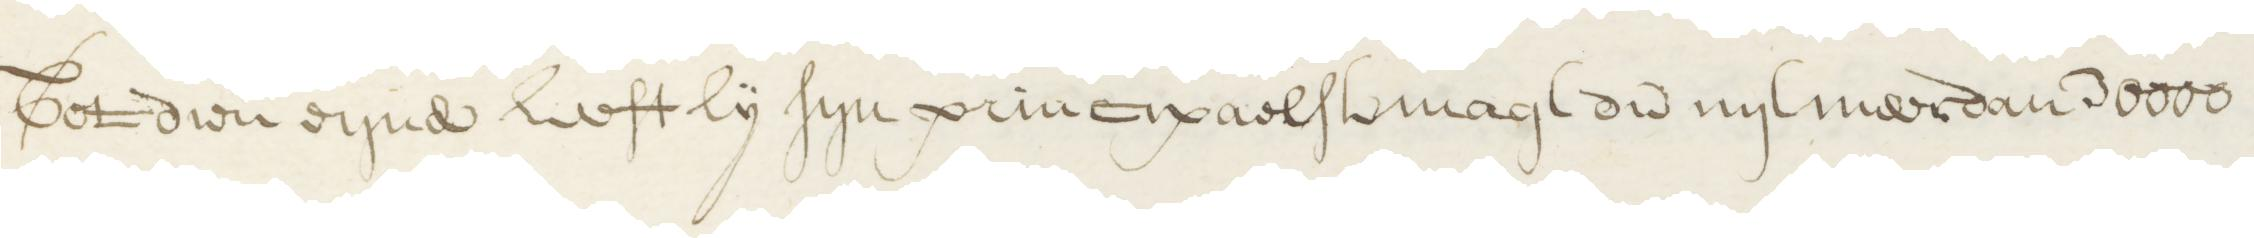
Tot dien eynde heeft hij syn principaelste magt die uyt meer dan 30000
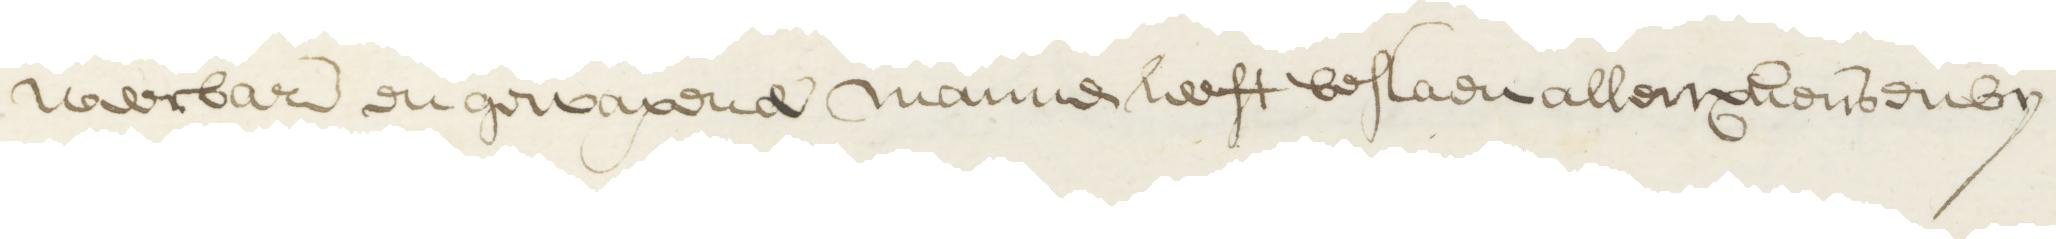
weerbare en gewapende mannen heeft bestaen allen chonsen bij
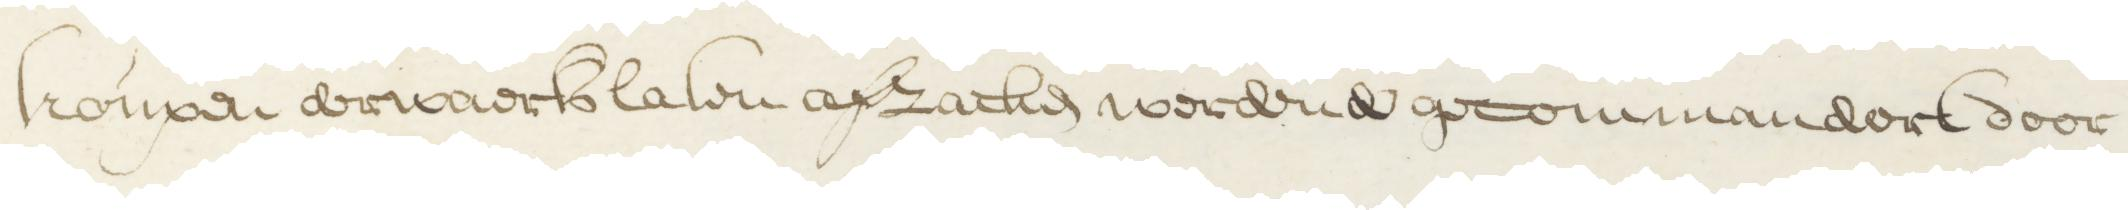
troupen derwaerts laten afzacken werdende gecommandeert door
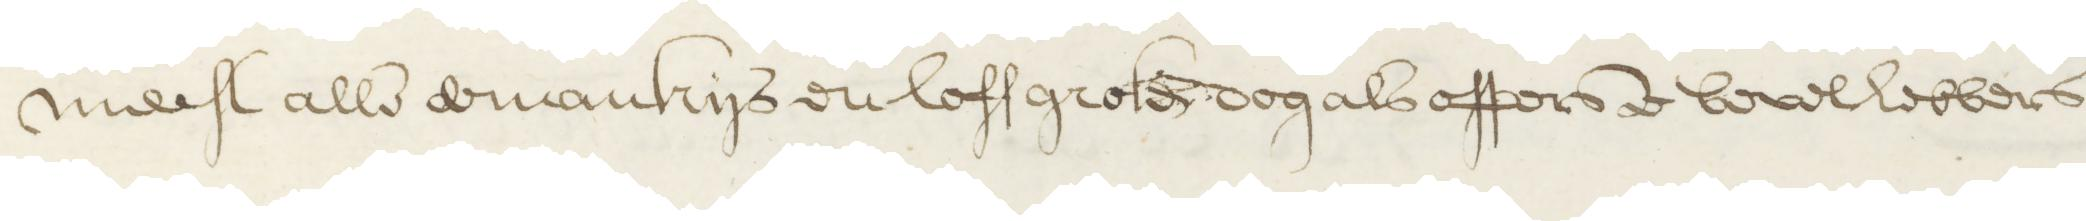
meest alle de mankijsen hoff groten dog als opporste bevelhebbers
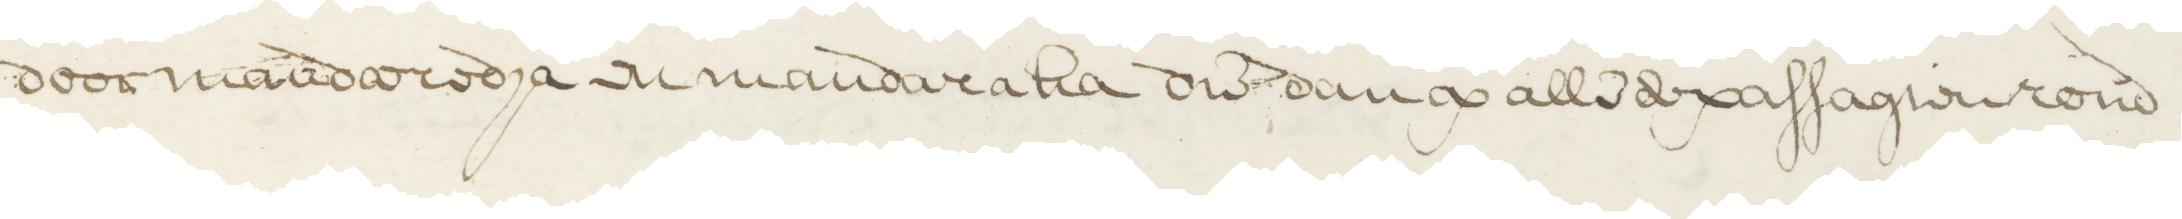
door maadaredja en mandaraka die dan op alle de passagien rond
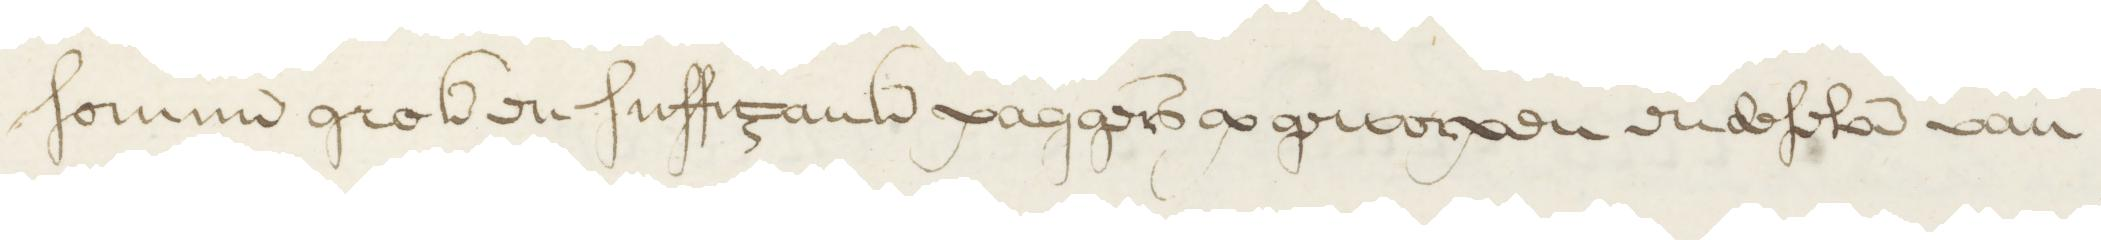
somme grote en suffiçante paggers op geworpen en deselve van
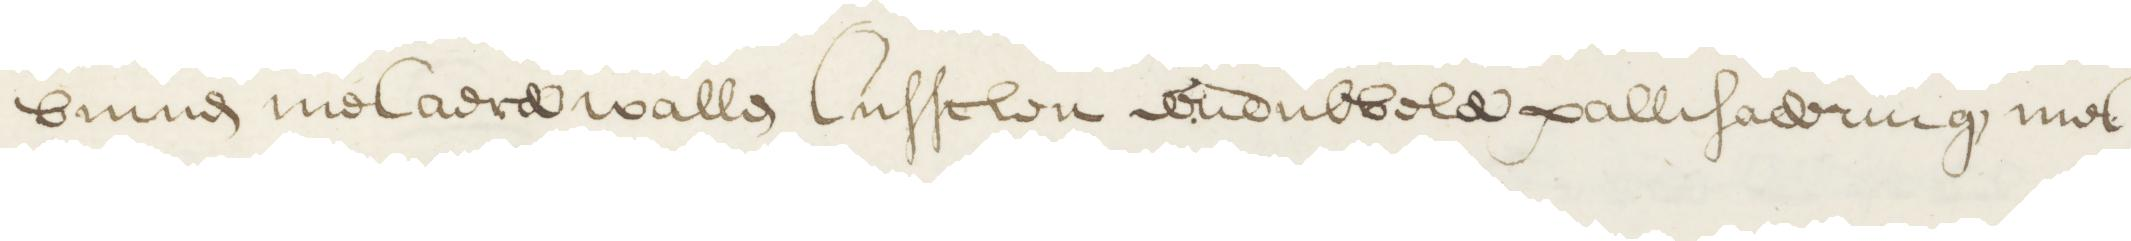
binnen met aerde wallen tusschen een dubbelde pallisadering, met
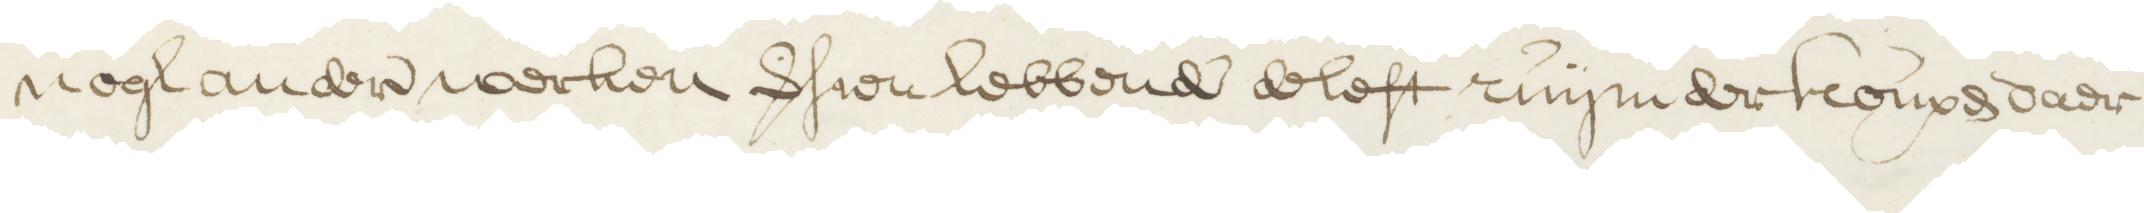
nogh ander werken versien hebbende de heft ruijm der troupen daer
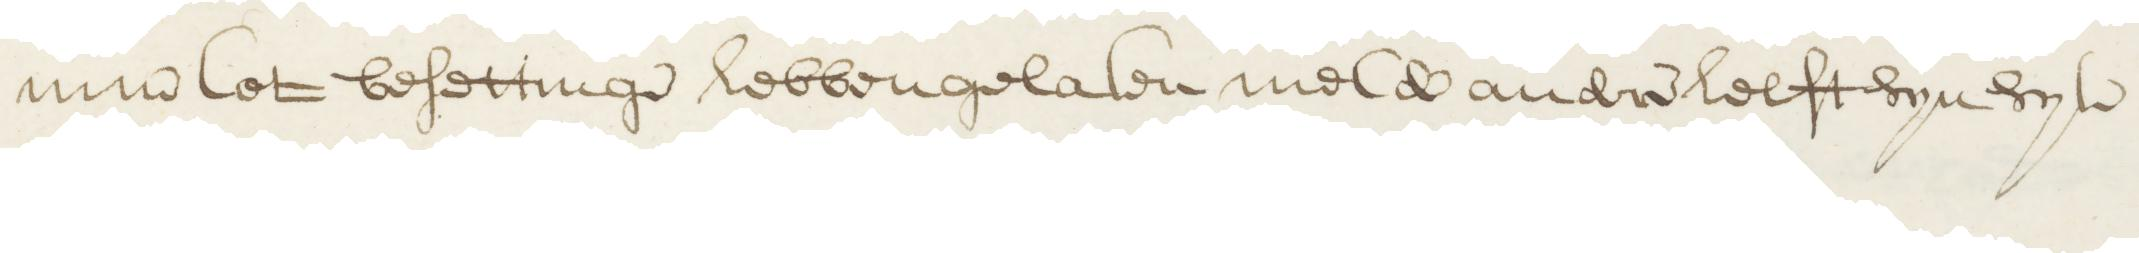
inne tot besettinge hebben gelaten met de andre helft syn sij te
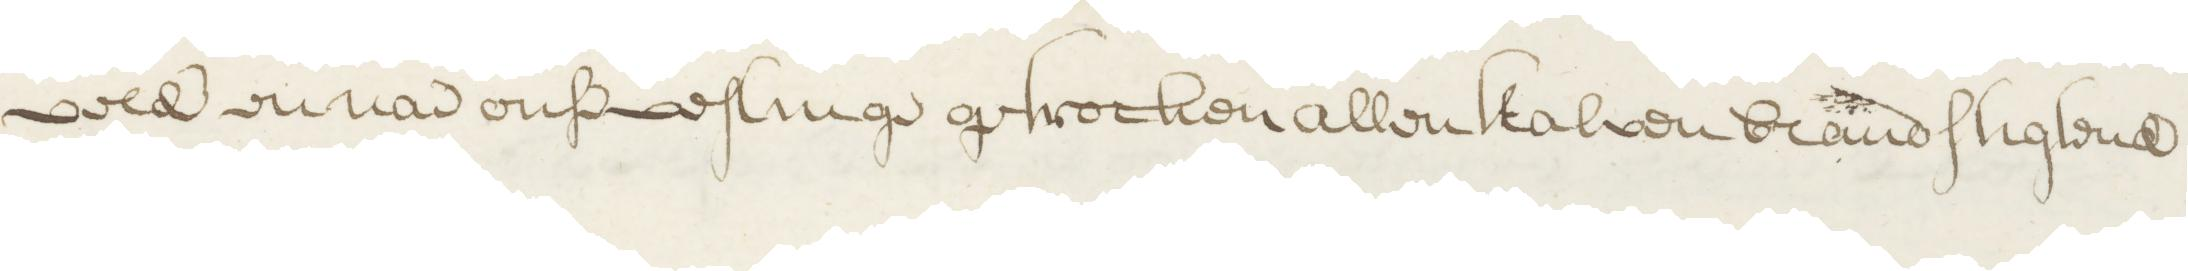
velde en nae onse vestinge getrocken allen t halven brandstigtende
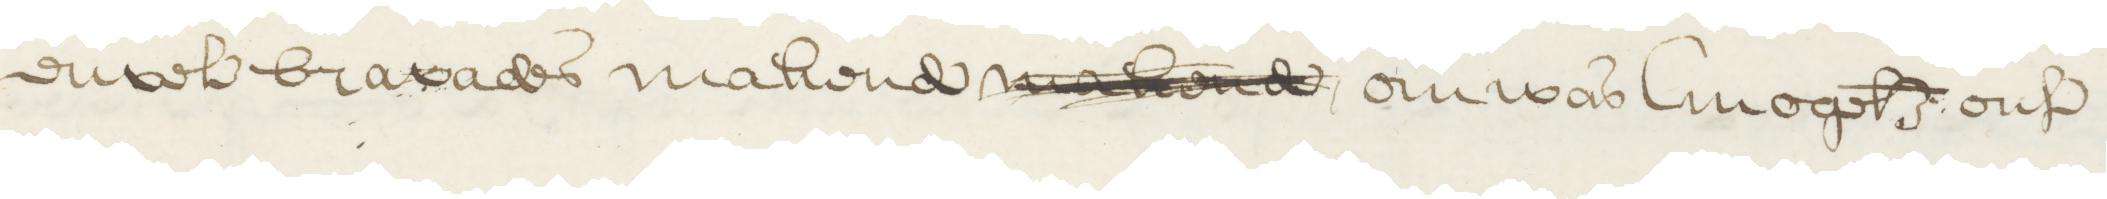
en vele bravades makende makende, om was t mogelijk: onse
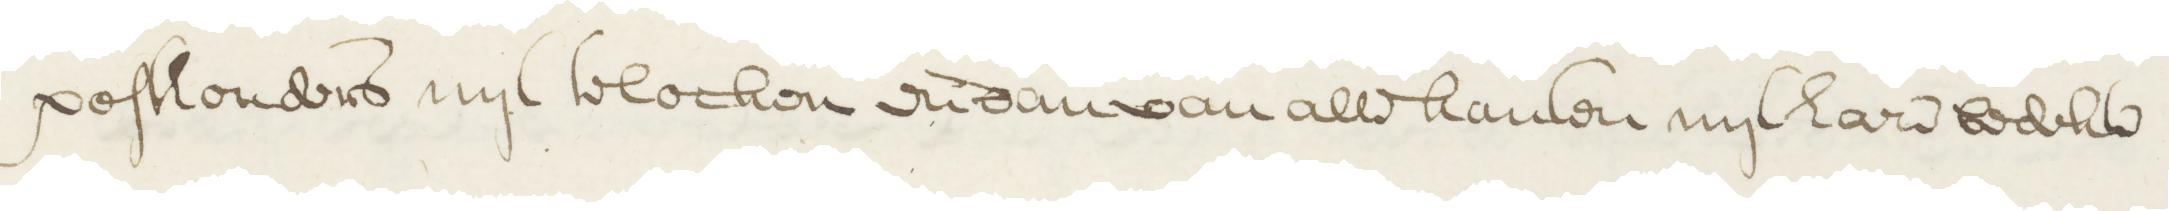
posthouders uyt te locken en dan van alle kanten uyt hare bedekte
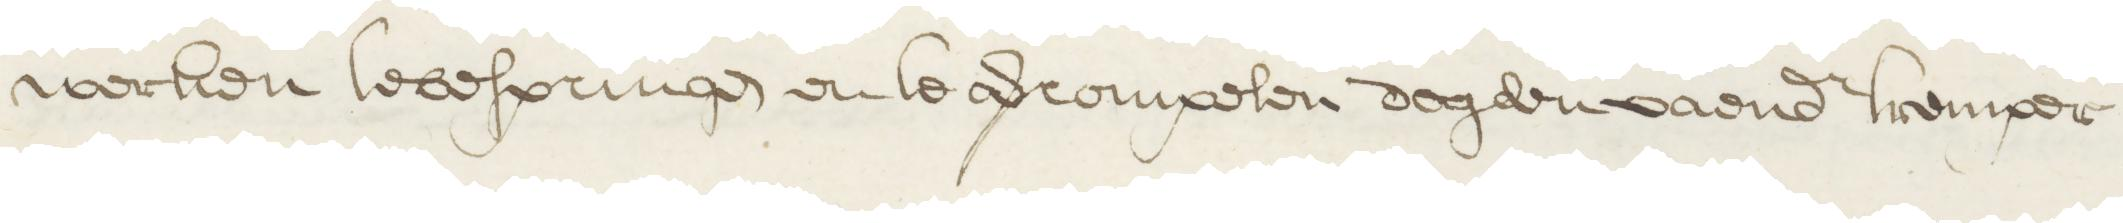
werken te bespringen en te overrompelen dog den vaendr tremper
